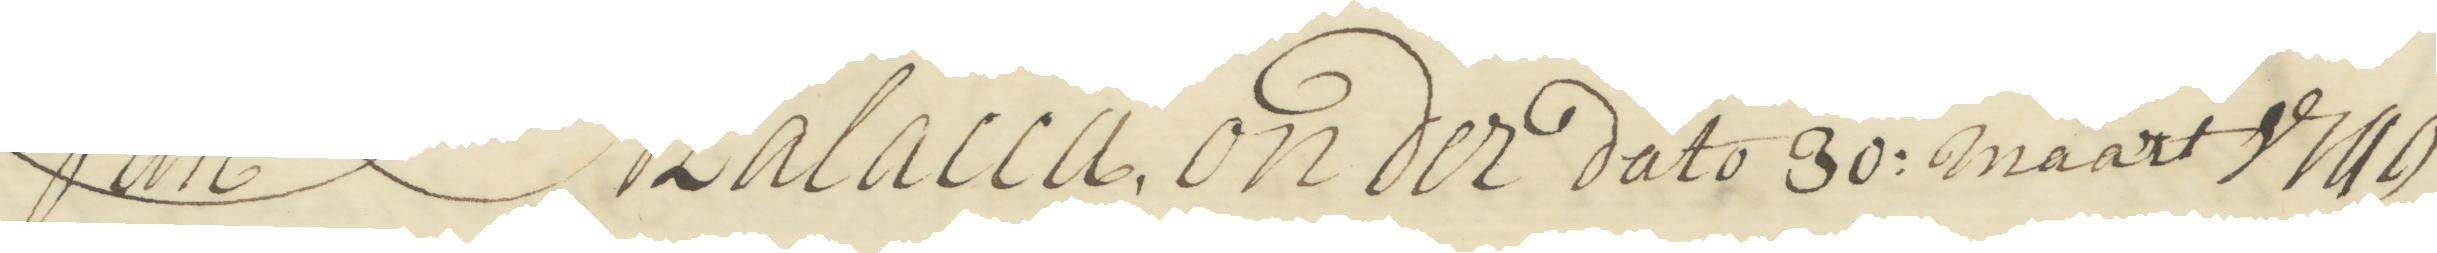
Van Malacca, onder dato 30: maart 1749
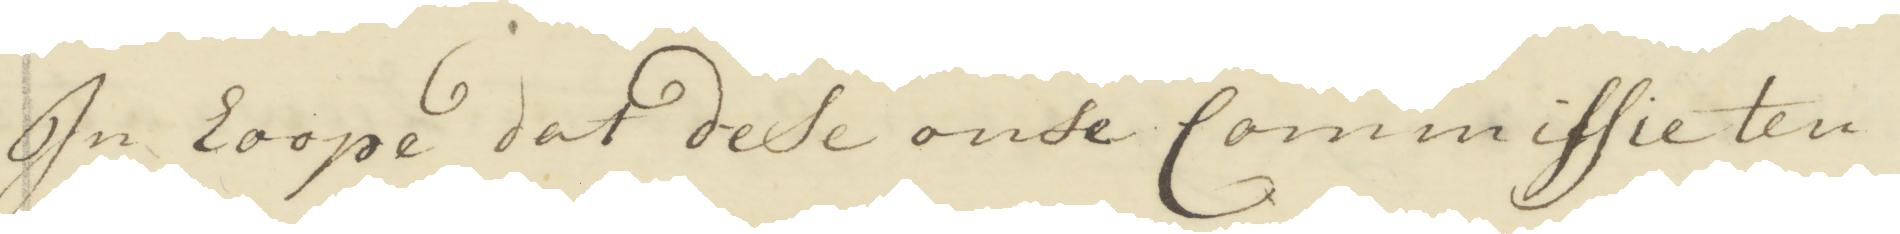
Jn hoope dat dese onse Commissie ten
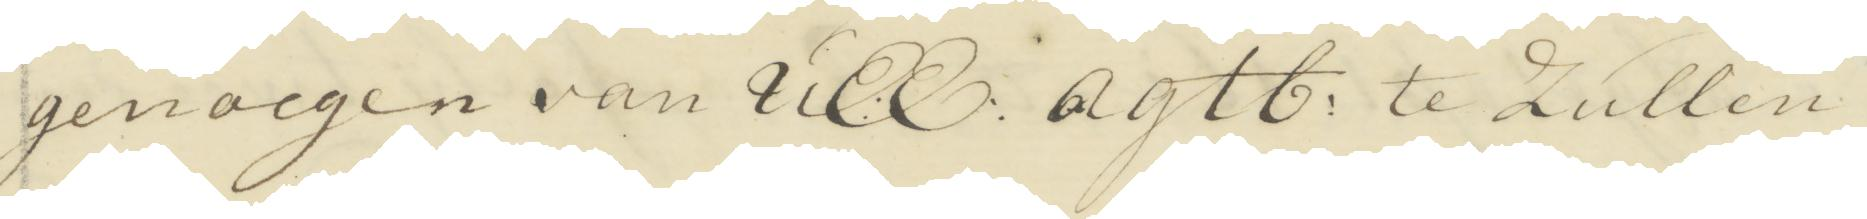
genoegen van U E: E: agtb: te zullen
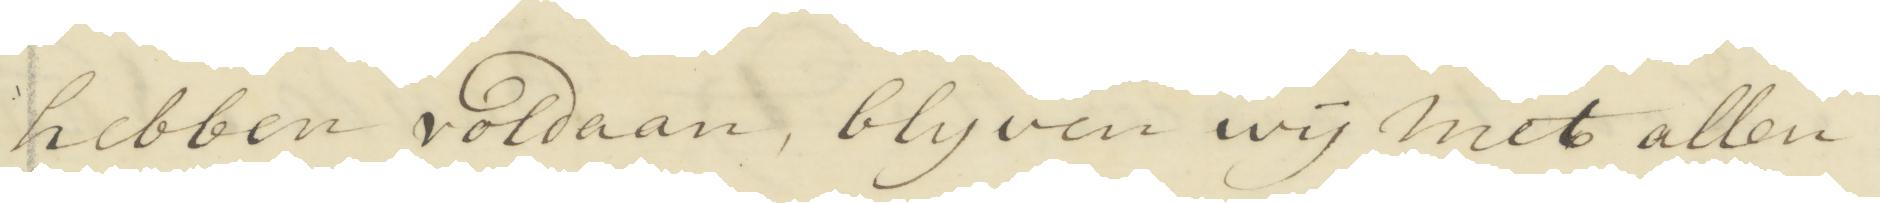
hebben voldaan, blyven wij met allen
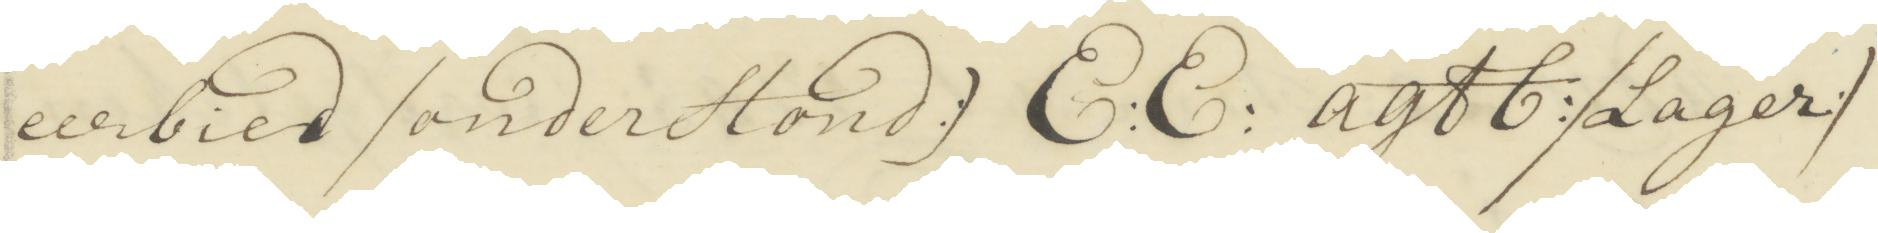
eerbied / onderstond :/ E: E: agtb: / Lager :/
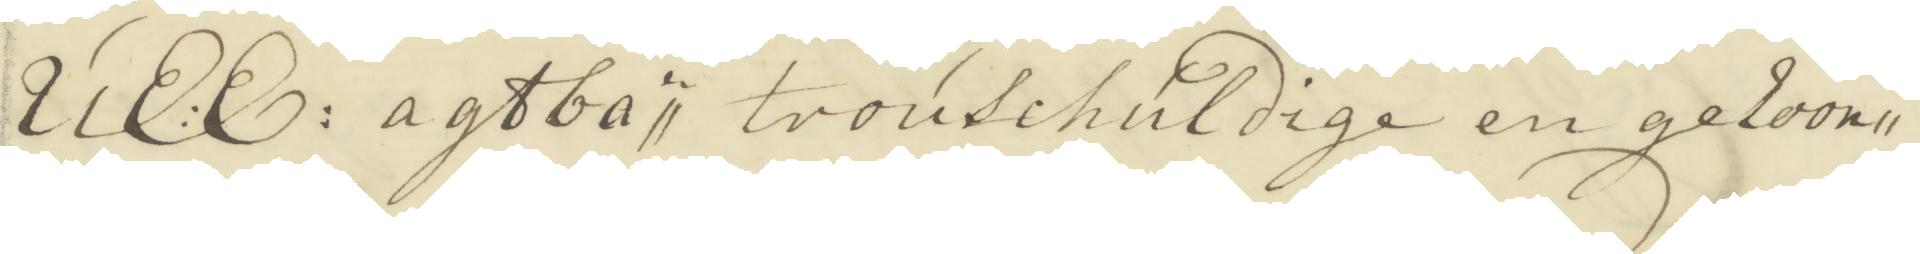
U E: E: agtba„n trouschuldige en gehoor„
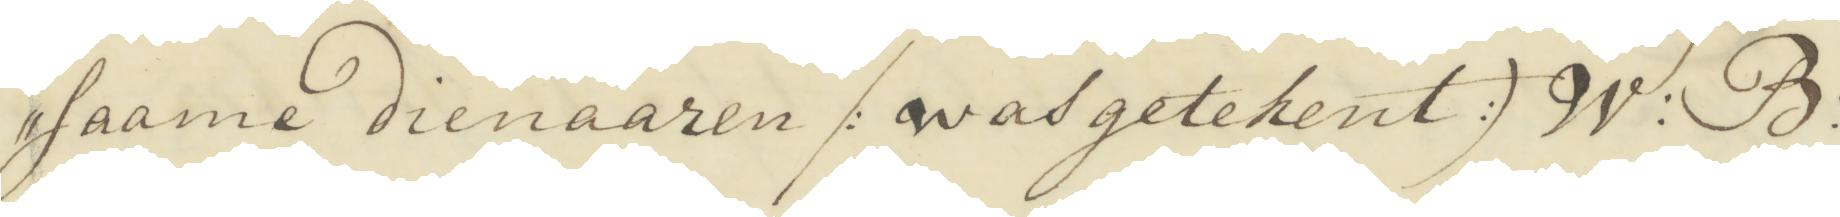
„saame dienaaren /: was getekent :/ W: B:
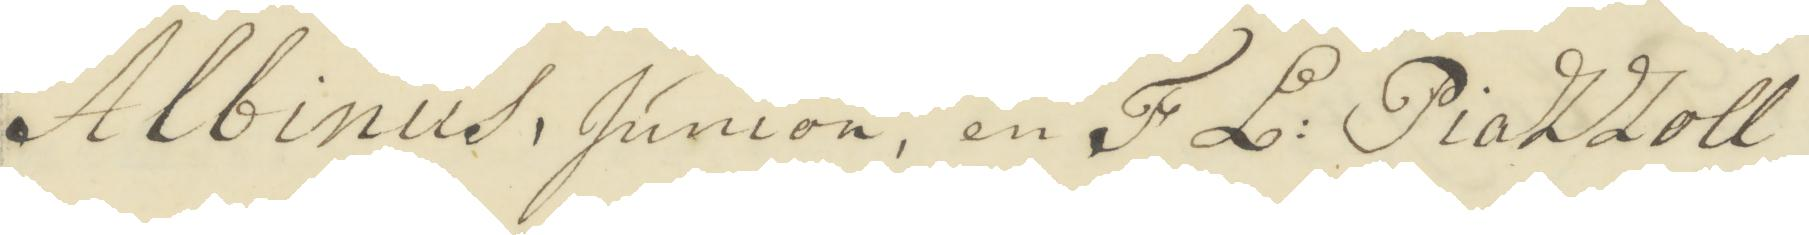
Albinus, Junior, en F L: Piazzoll
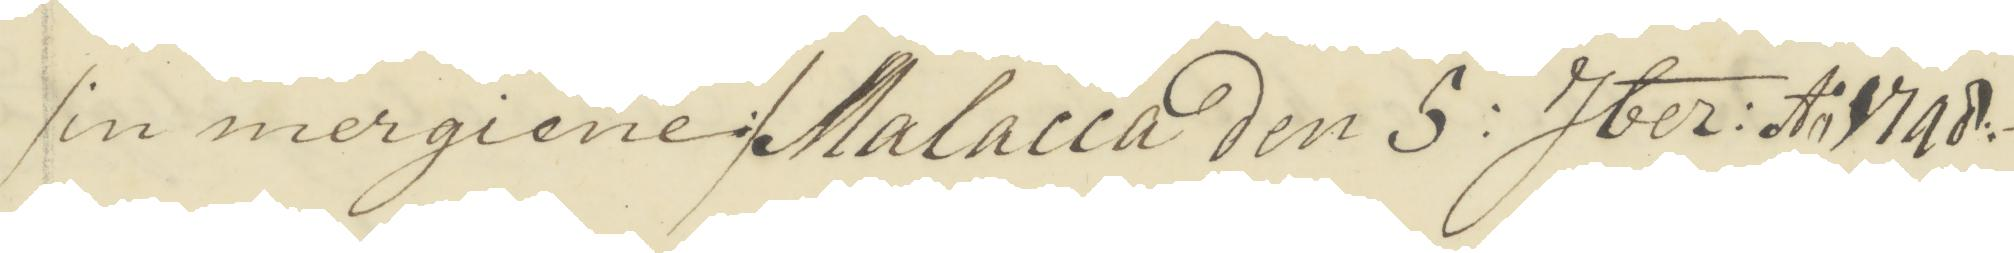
/ in mergiene :/ Malacca den 5: Jber: A„o 1748 :—
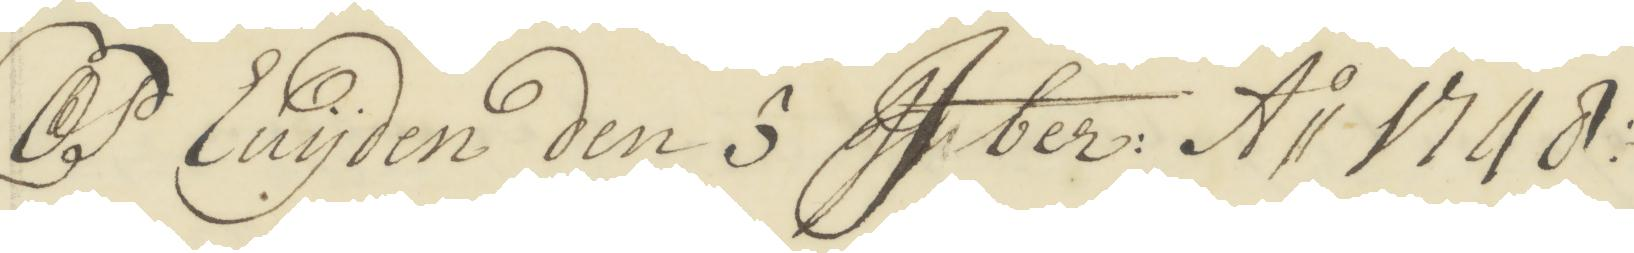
Op huijden den 5 Jber: A„o 1748 :
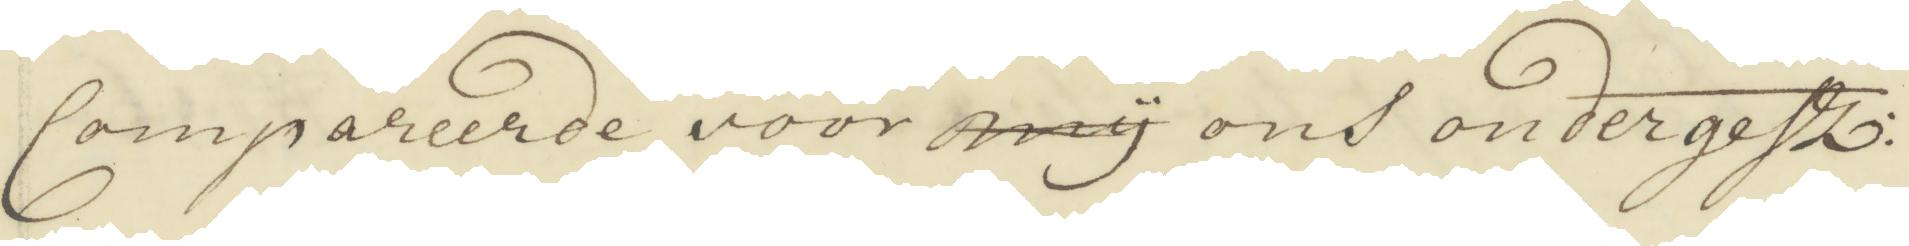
Compareerde voor mij ons ondergesz:
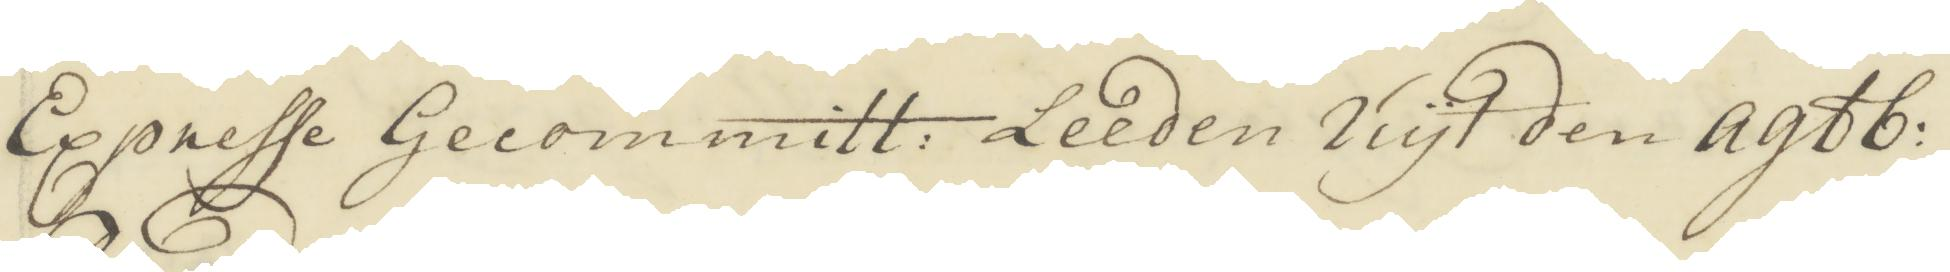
Expresse Gecommitt: Leeden uijt den agtb:
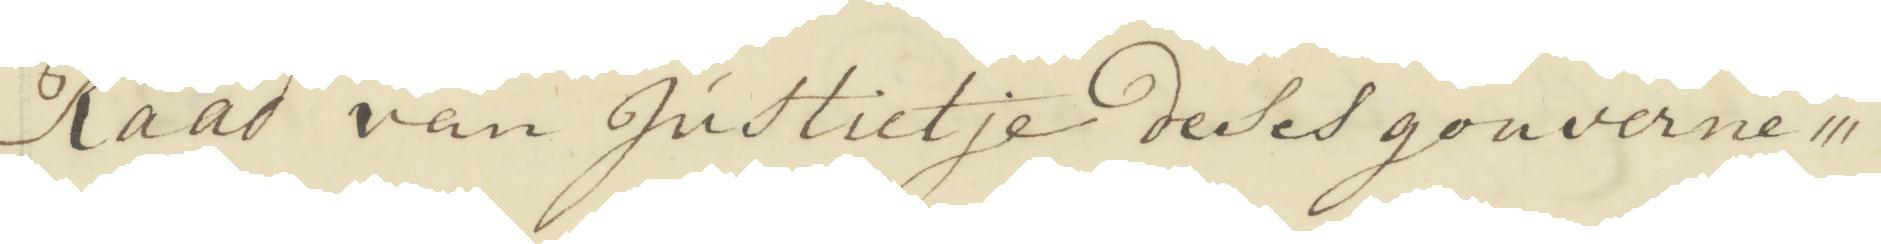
Raad van Justietje deses gouverne„
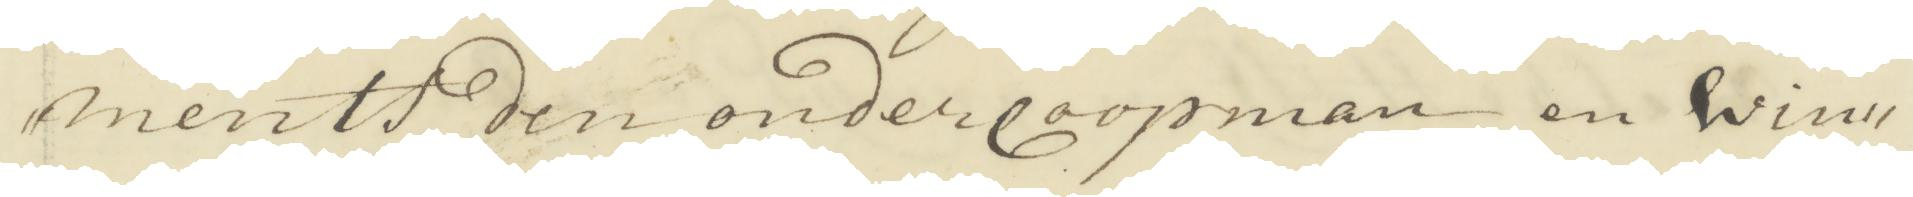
„ments den ondercoopman en win„
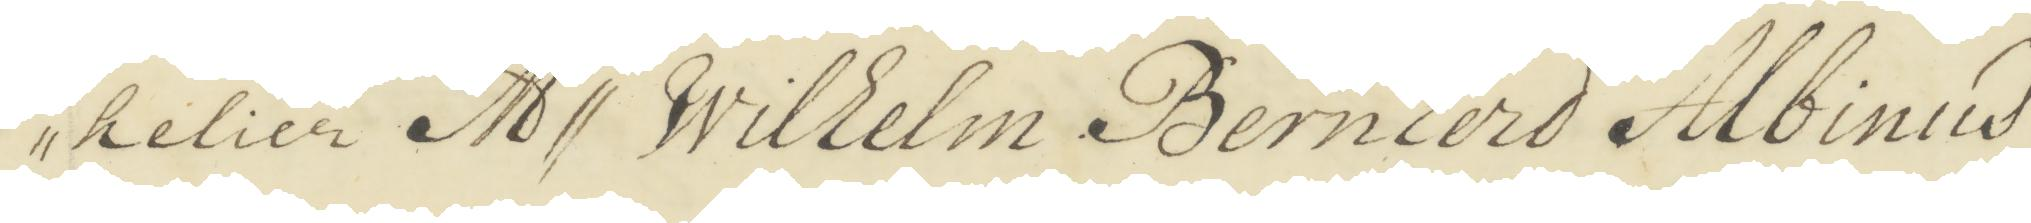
„kelier M„r Wilhelm Bernherd Albinus
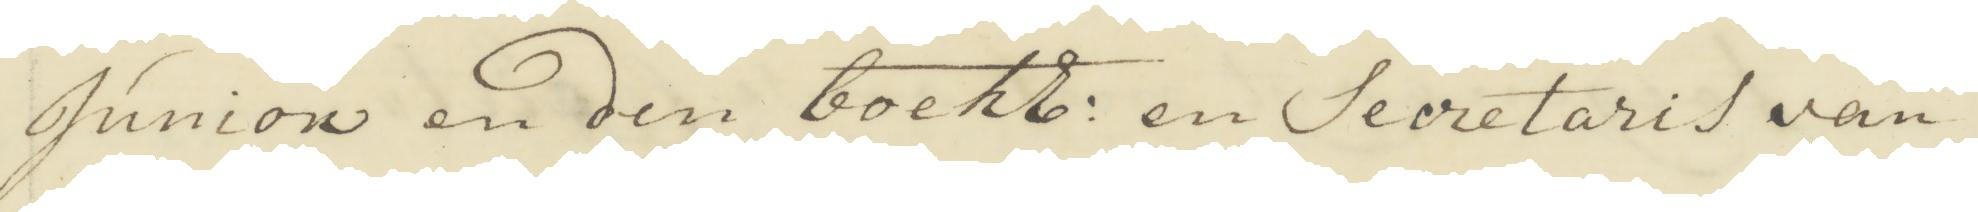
Junior en den boekh: en secretaris van
